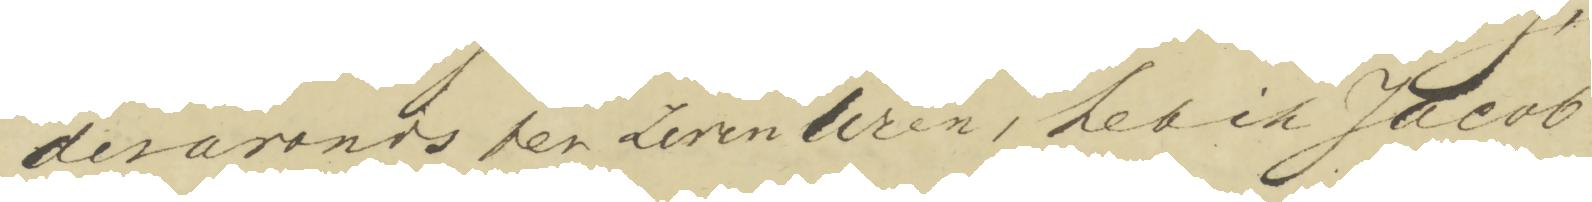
des avonts ter zeven uren, heb ik Jacob
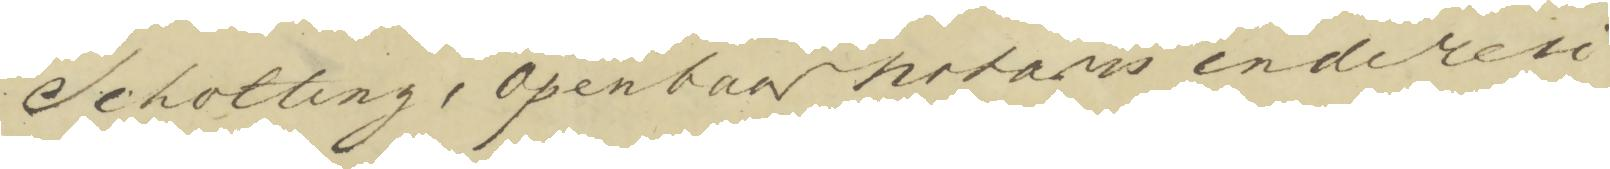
Scholting, openbaar notaris in de resi
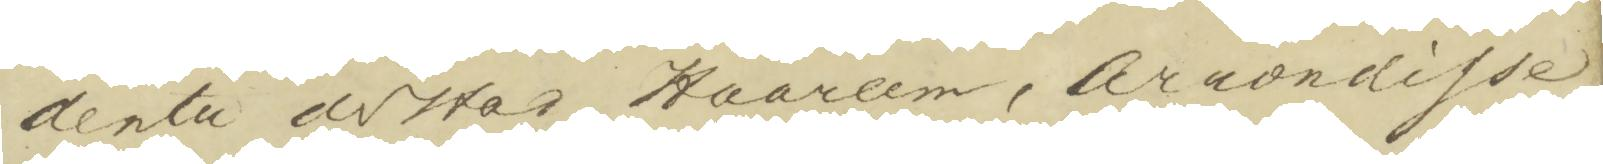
dentie de stad Haarlem, Arrondisse
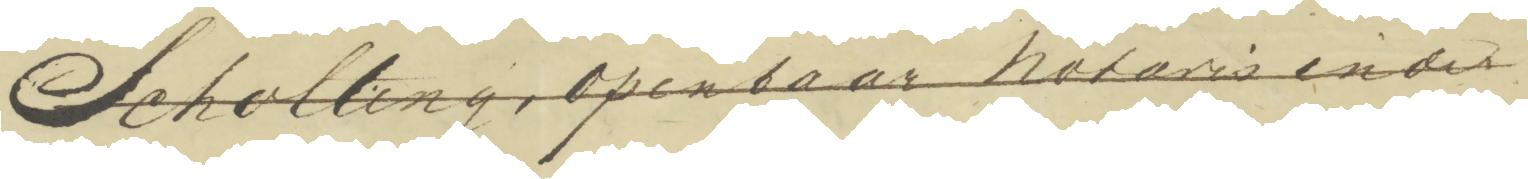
Scholting, openbaar Notaris in de
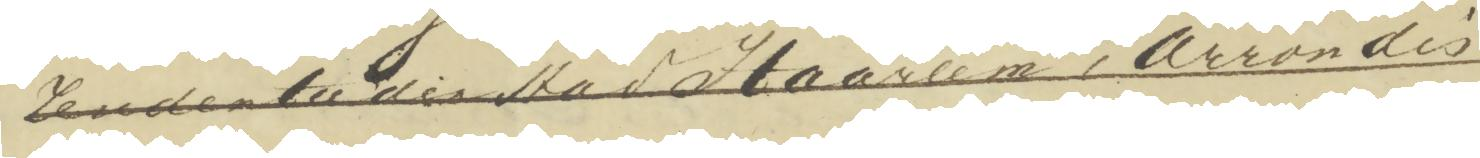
residentie den stad Haarlem, Arrondis
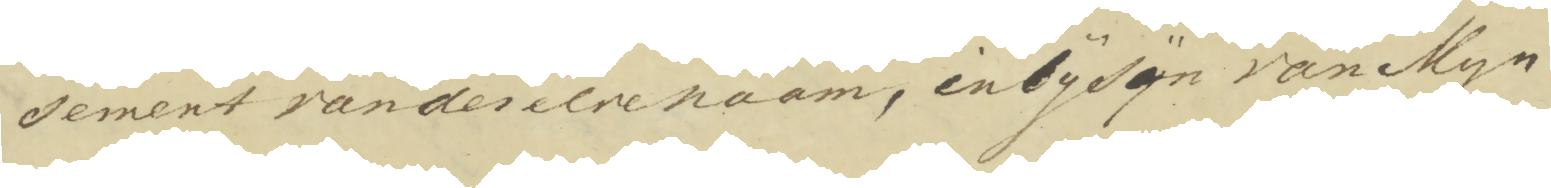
sement van deselve naam, in bijsijn van Myn
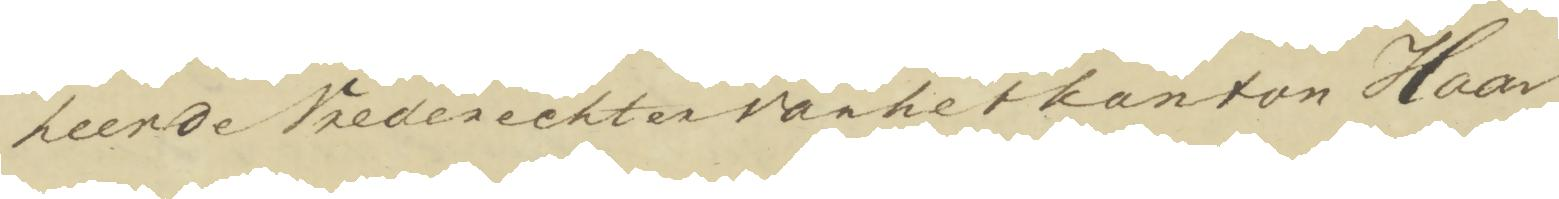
heer de Vrederechter van het kanton Haar
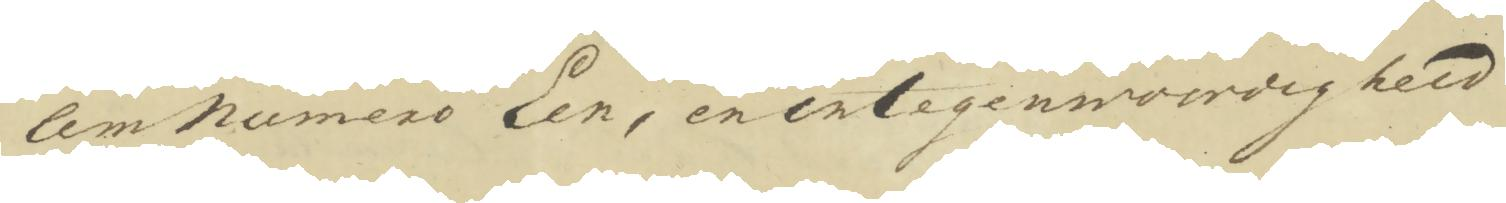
lem numero Een, en integenwoordigheid
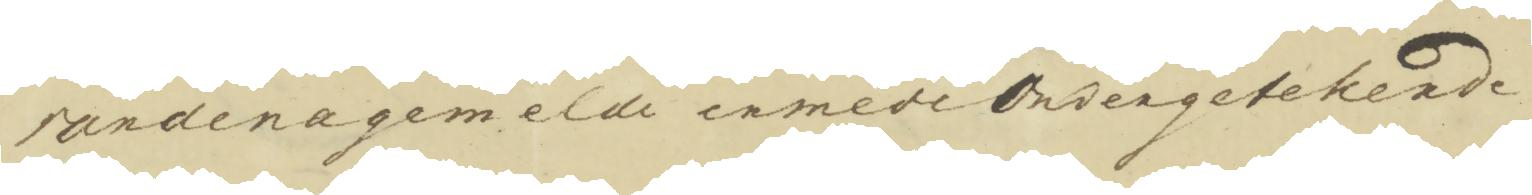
van de na gemelde en mede ondergetekende
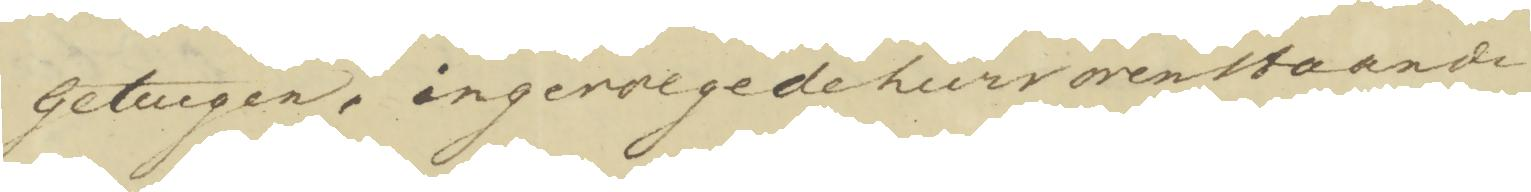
Getuigen, ingevolge de hier vorenstaande
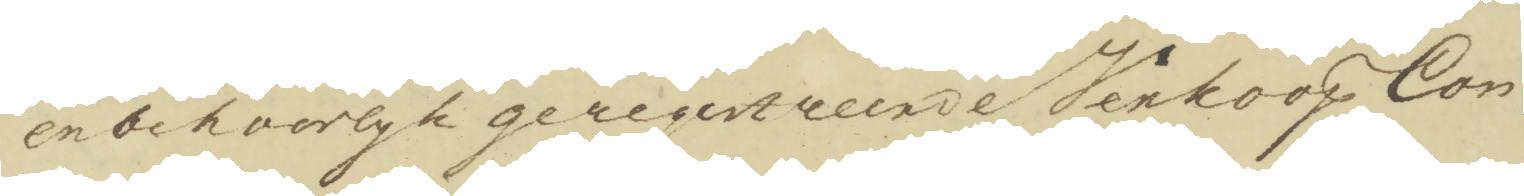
en behoorlyk geregistreerde Verkoop Con
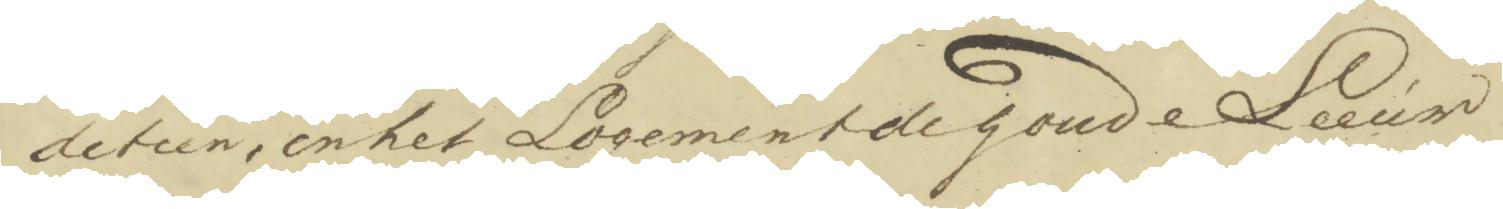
ditien, en het Logement de goude Leeuw
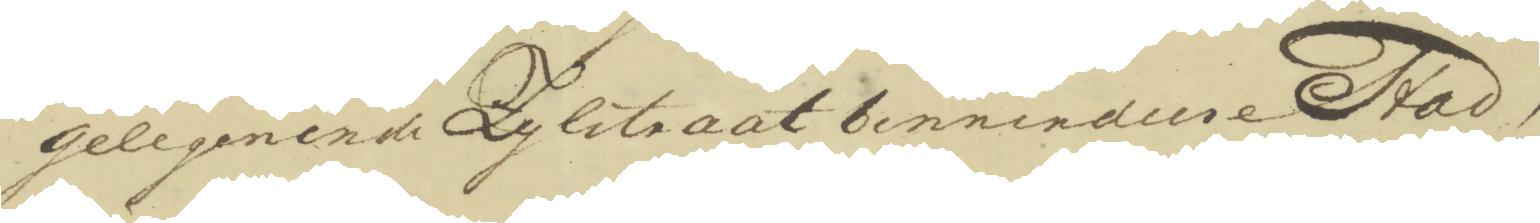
gelegen in de Zylstraat binnen deese Stad,
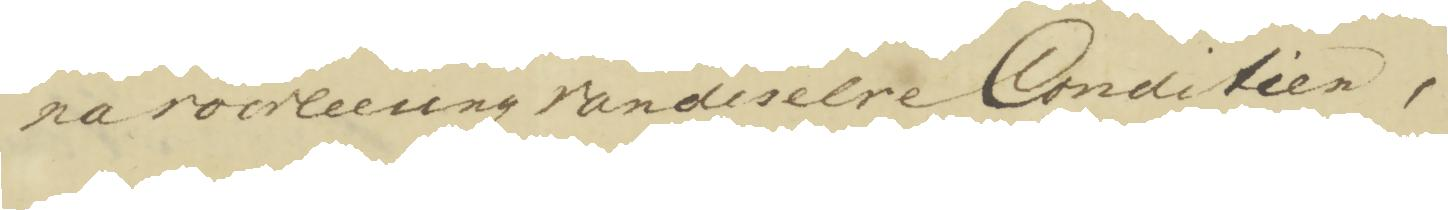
na voorleezing van deselve Conditien,
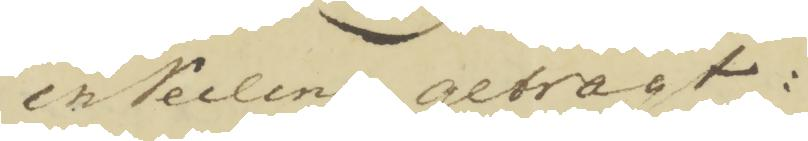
in veiling gebragt:
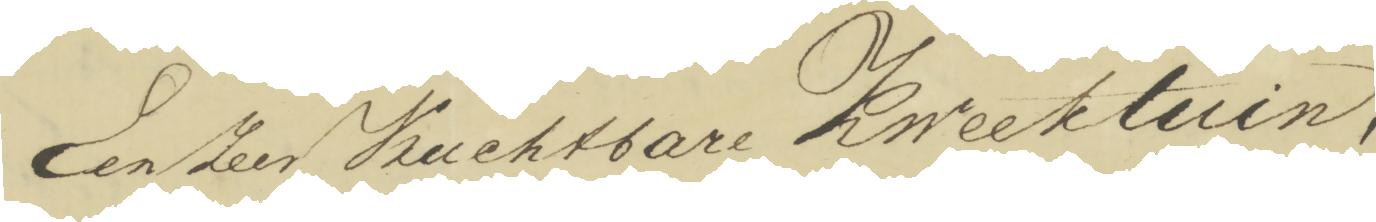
Een Zeer Vruchtbare Kweektuin,
